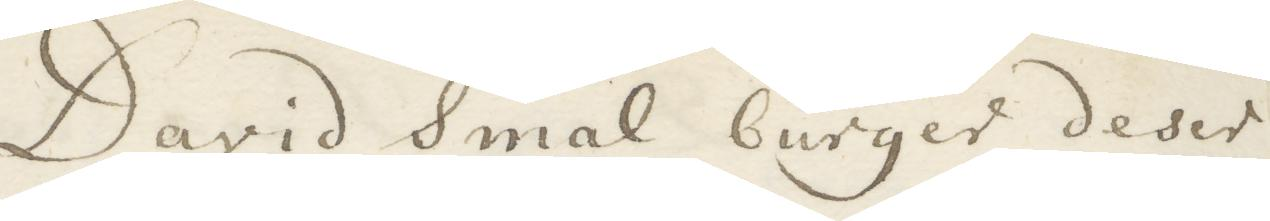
David smal burger deser
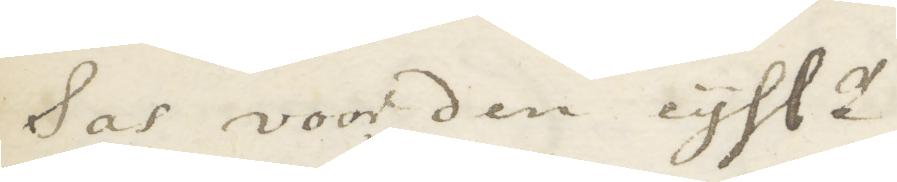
sas voor den eijssr
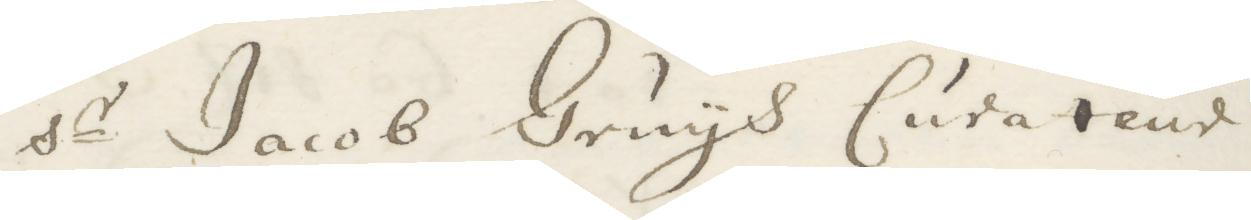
s=r Iacob Pruijs Curateur
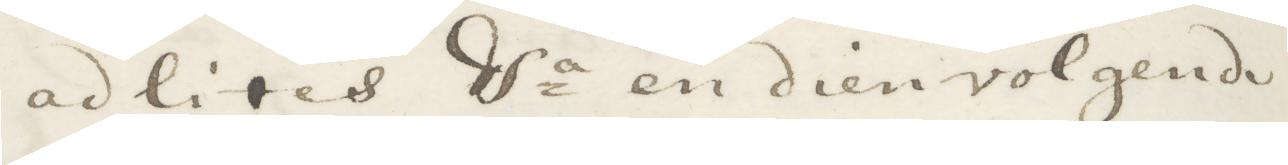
adlites &=o en dien volgende
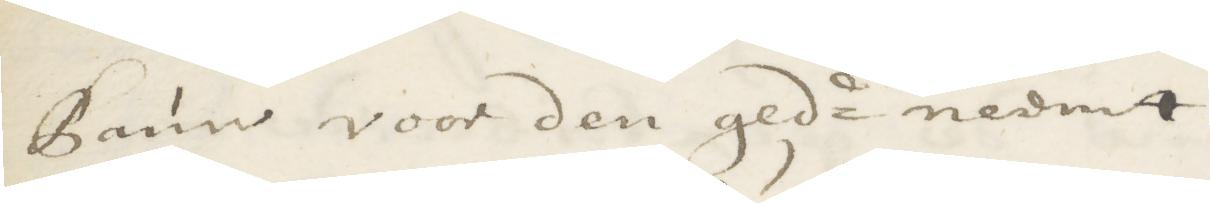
Bauw voor den ged=te neemt
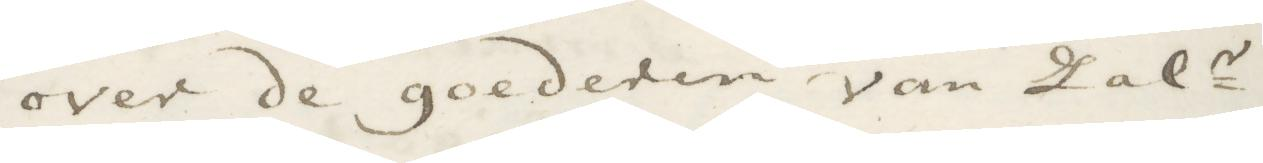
over de goederen van zal=
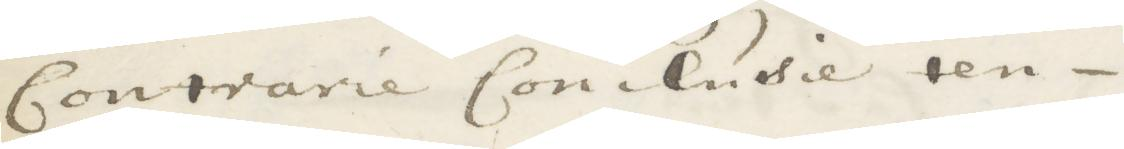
Contrarie Conilusie ten —
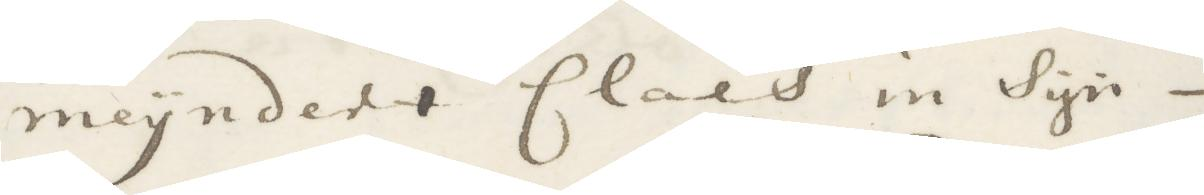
meijndert Claes in sijn —
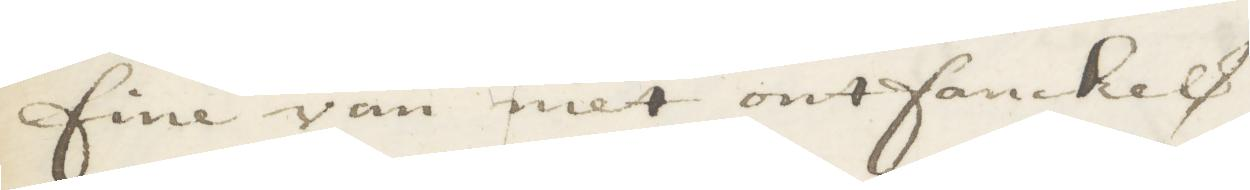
fine van niet ontfanckel
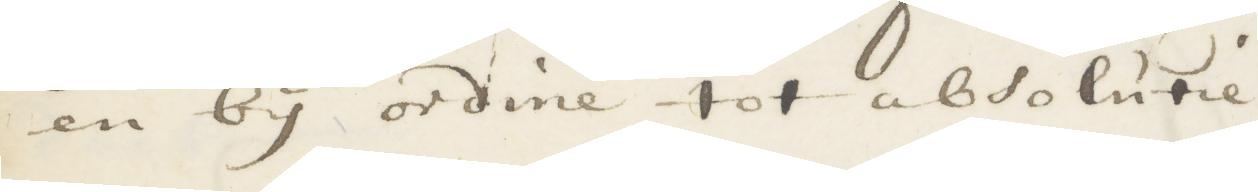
en bij ordine tot absolutie
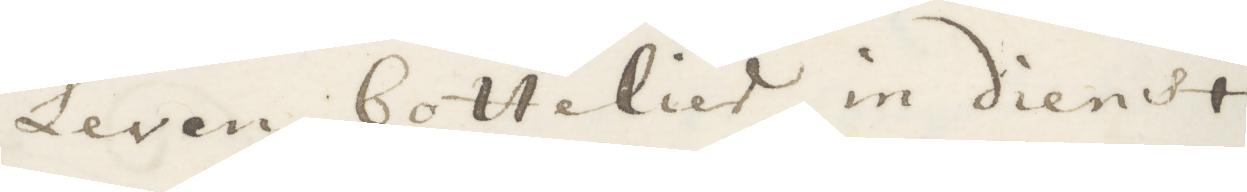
zeven botteliet in dienst
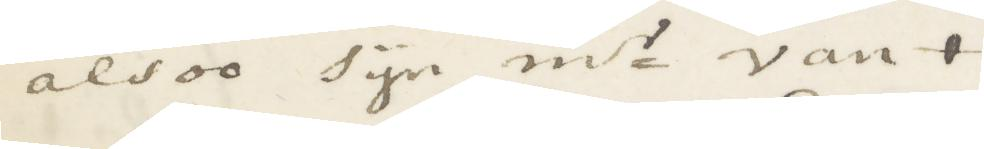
alsoo sijn m=t van't
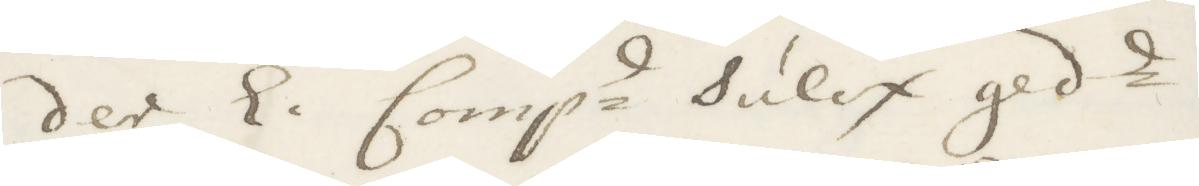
der E: Comp=e sulcx ged=te
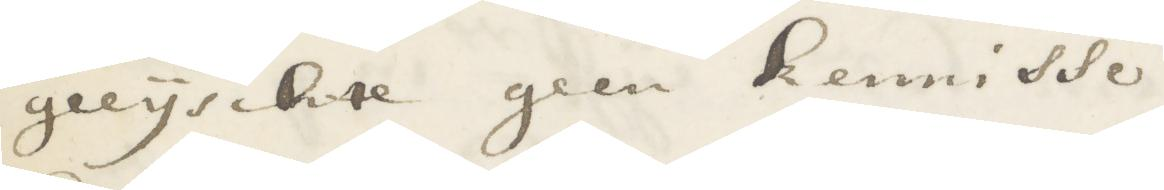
geeijschte geen kennisse
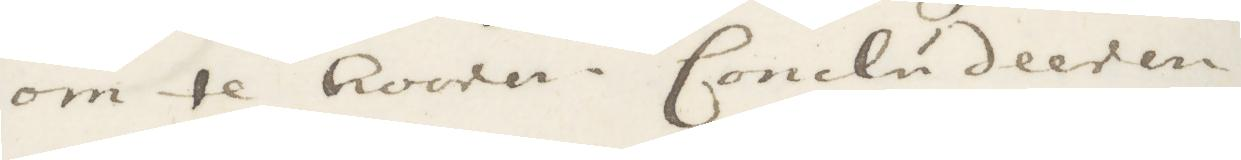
om te hooven Coniludeeren
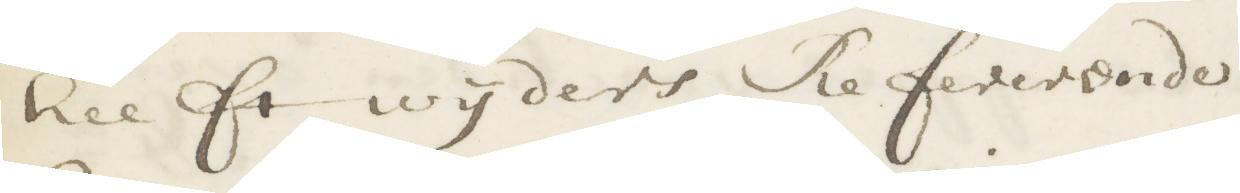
heefft wijders Refeverende
